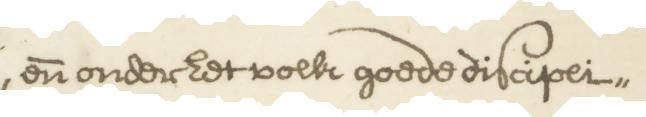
en onder het volk goede discipli„
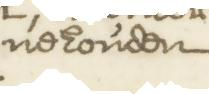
ne houden
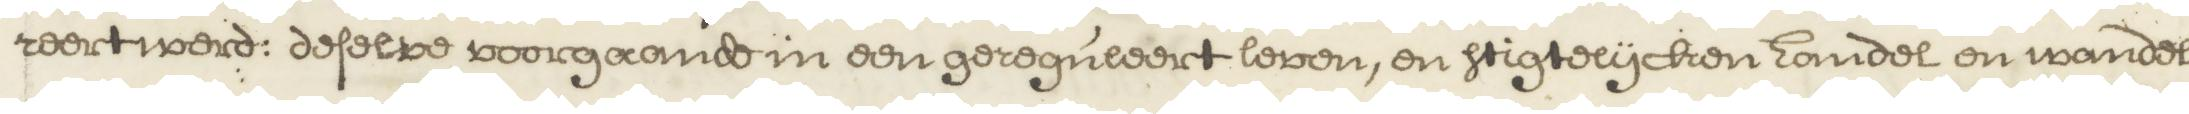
reert werd: deselve voor gaande in een gereguleert leven, en stigtelijcken handel en wandel,
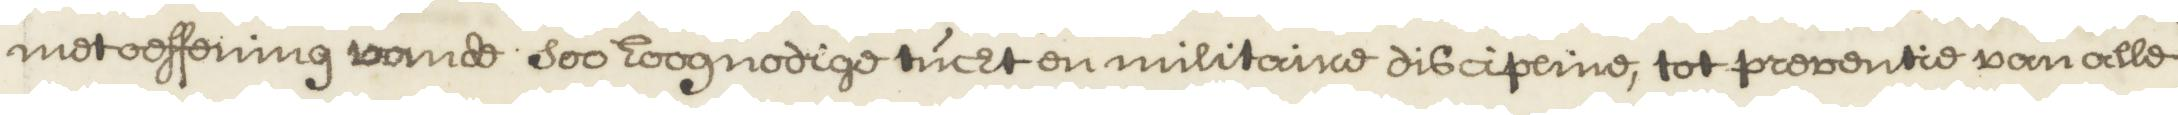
met oeffening van de soo hoognodige tucht en militaire discipline tot preventie van alle
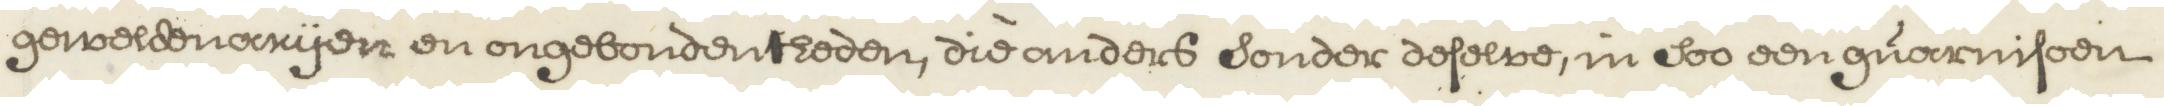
geweldenarijen en ongebondentheden, die anders sonder deselve, in soo een guarnisoen
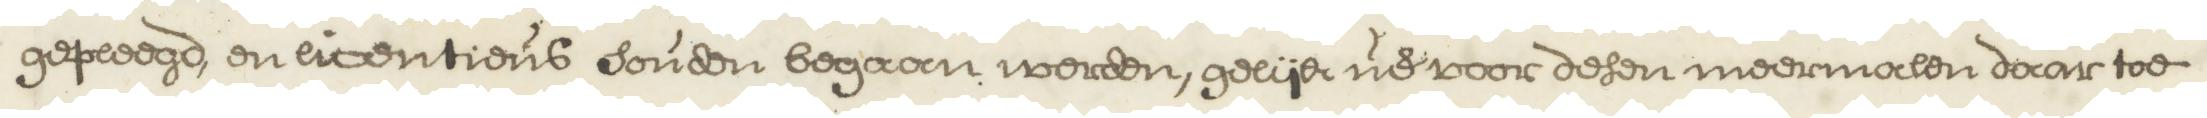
gepleegd, en licentieus souden begaan worden, gelijk uE voor desen meer malen daar toe
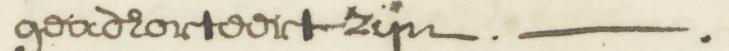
geadhorteert zijn. —.
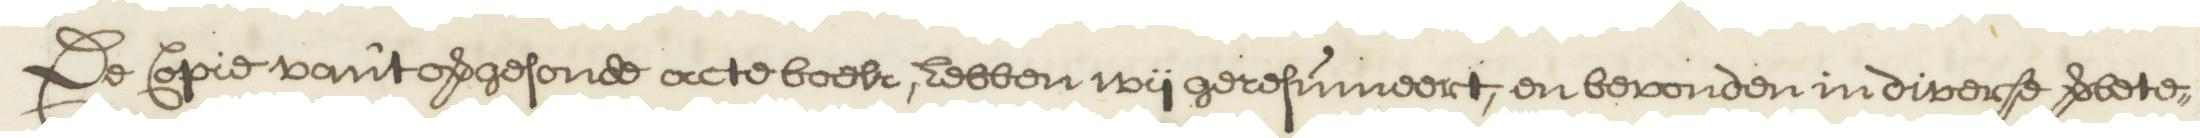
De Copie van’t overgesonde acte boek, hebben wij geresumeert, en bevonden in diverse verbete„
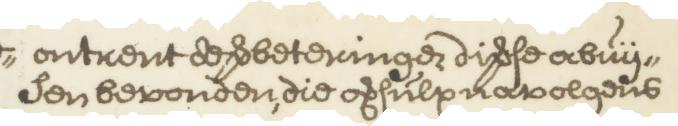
ontrent de verbeteringen diverse abuij„ sen bevonden, die oversulx navolgens
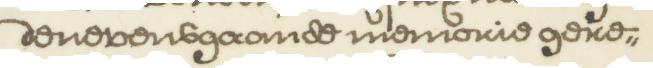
denevens gaande memorie gere„
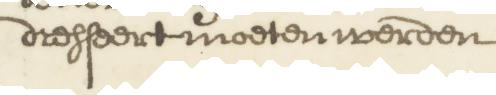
dresseert moeten werden
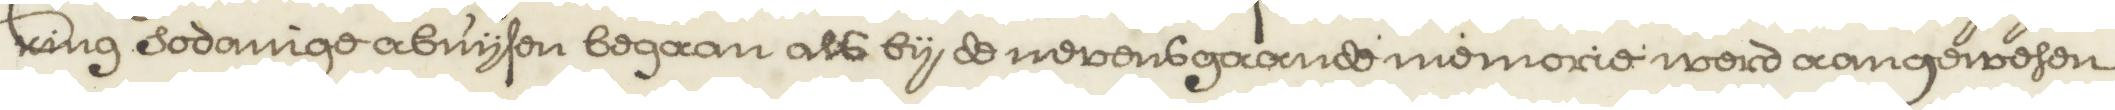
ring sodanige abuijsen begaan als bij de nevensgaande memorie werd aan gewesen,
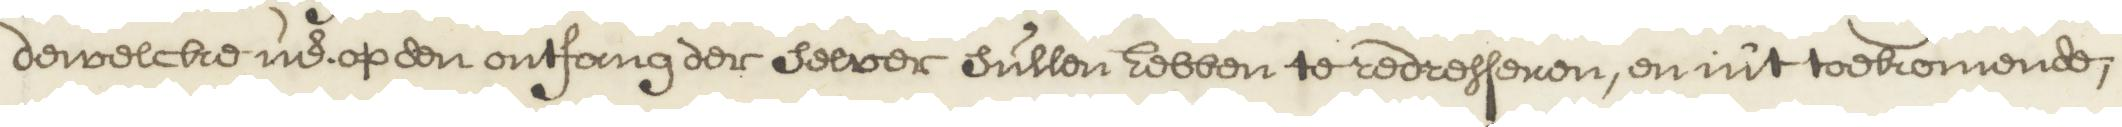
dewelcke uE. op den ontfang der selver sullen hebben te redresseren, en in’t toekomende,
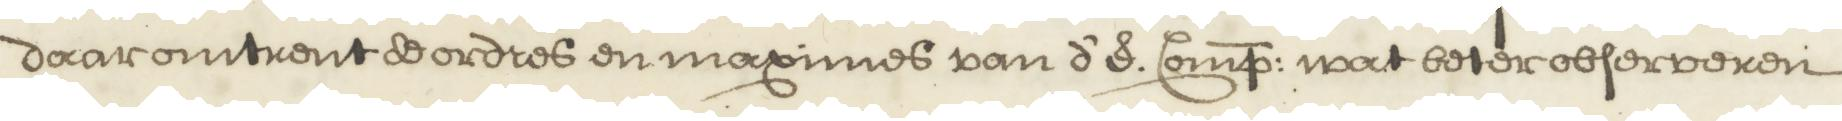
daar omtrent de ordres en maximes van d’ E. Comp: wat beter observeren
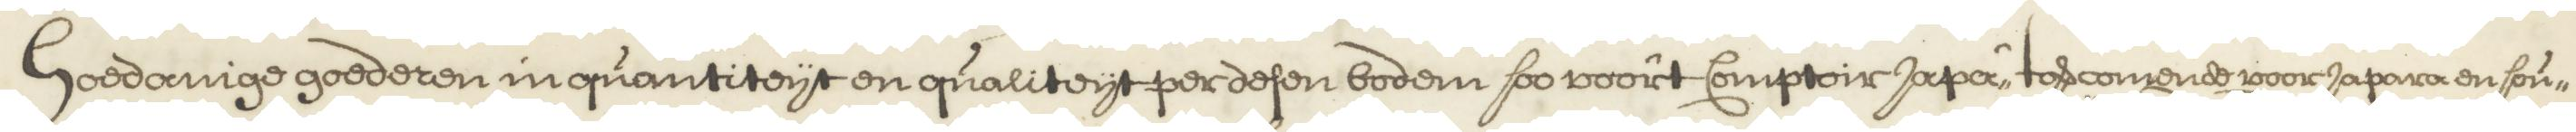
Hoedanige goederen in quantiteijt en qualiteijt per desen bodem so voor 't Comptoir Japa„ 't overcomende voor Japara en sou„
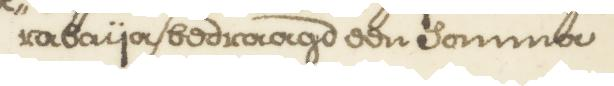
rabaija bedraagd een somma
